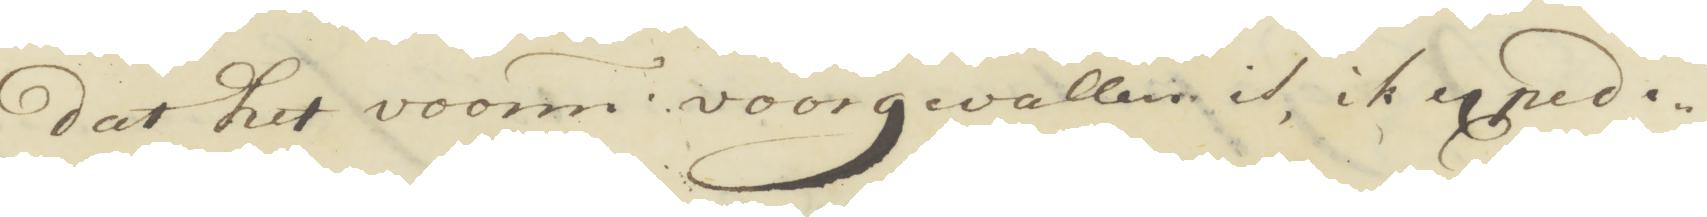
dat het voorm: voor gevallen is, ik expedi„
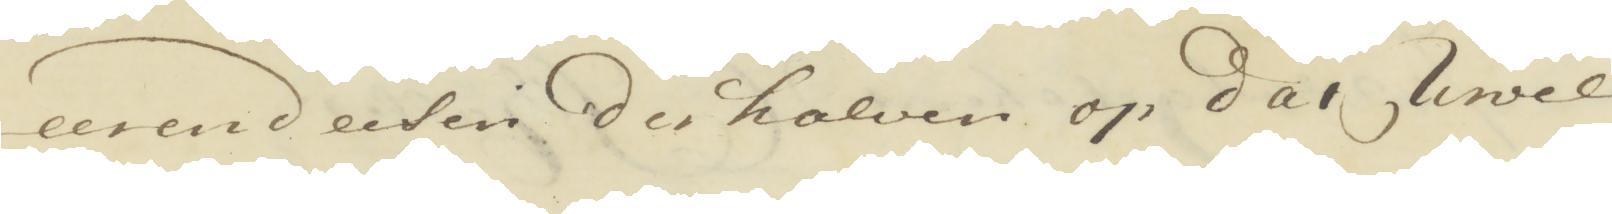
eeren deesen derhalven op dat Uwel
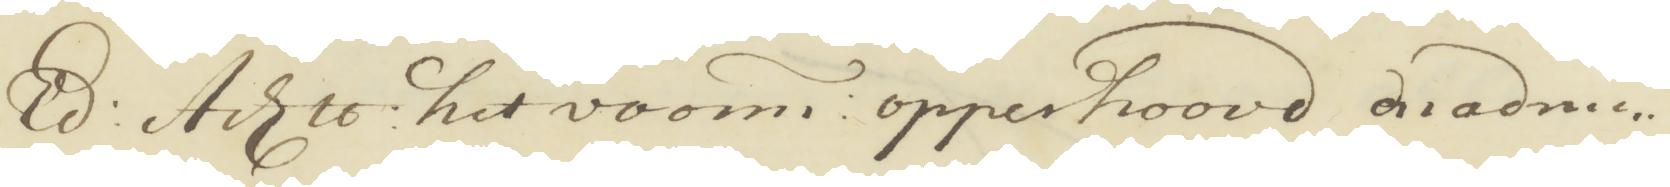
Ed: Achtb: het voorm: opperhoovd nadru„
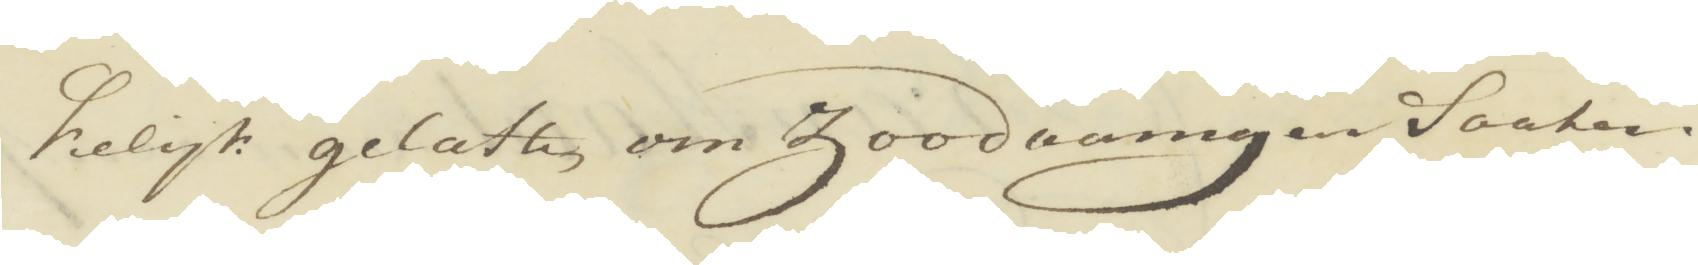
kelijk gelasten om zoodaanigen saaken
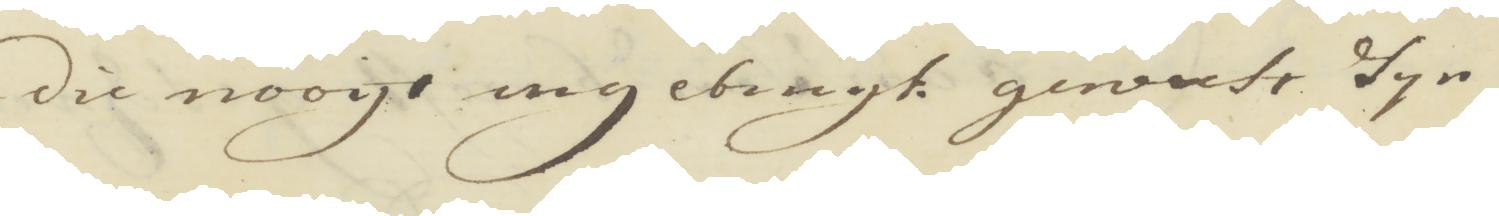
die nooijt ingebragt geweest syn
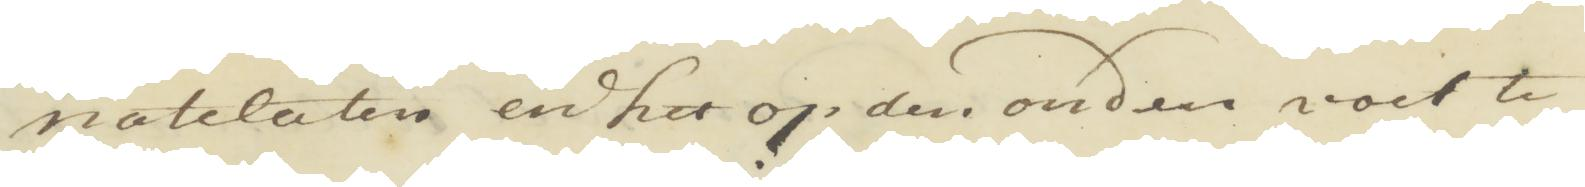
natelaten en het op den ouden voet te
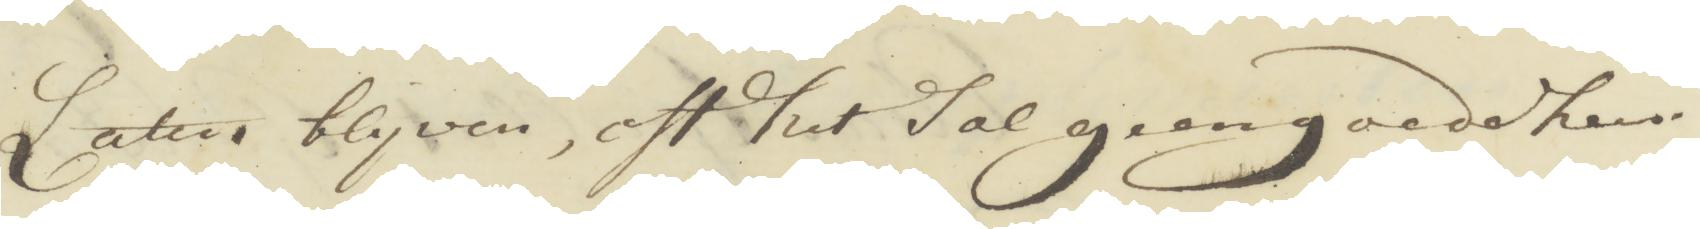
Laten blyven, oft het sal geen goede keer
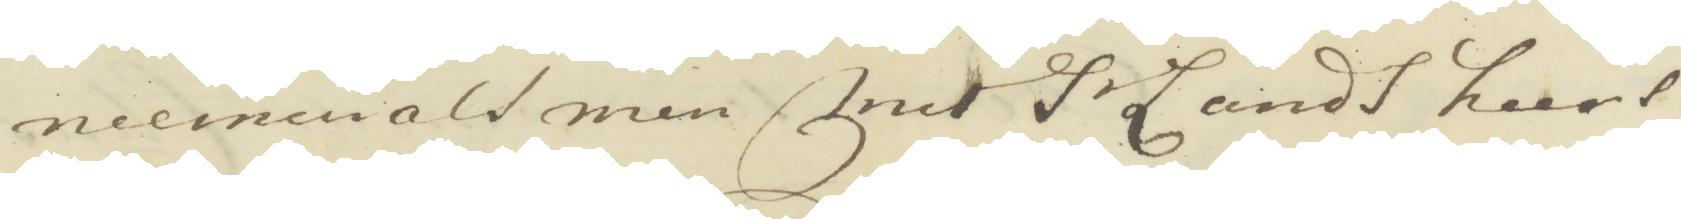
neemen als men met s' Lands heers
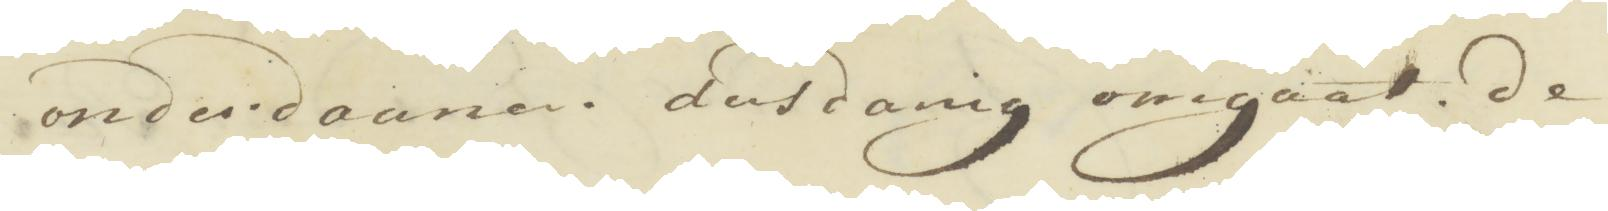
onderdaanen dusdanig omgaat. de
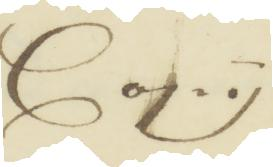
Copij
